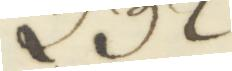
232
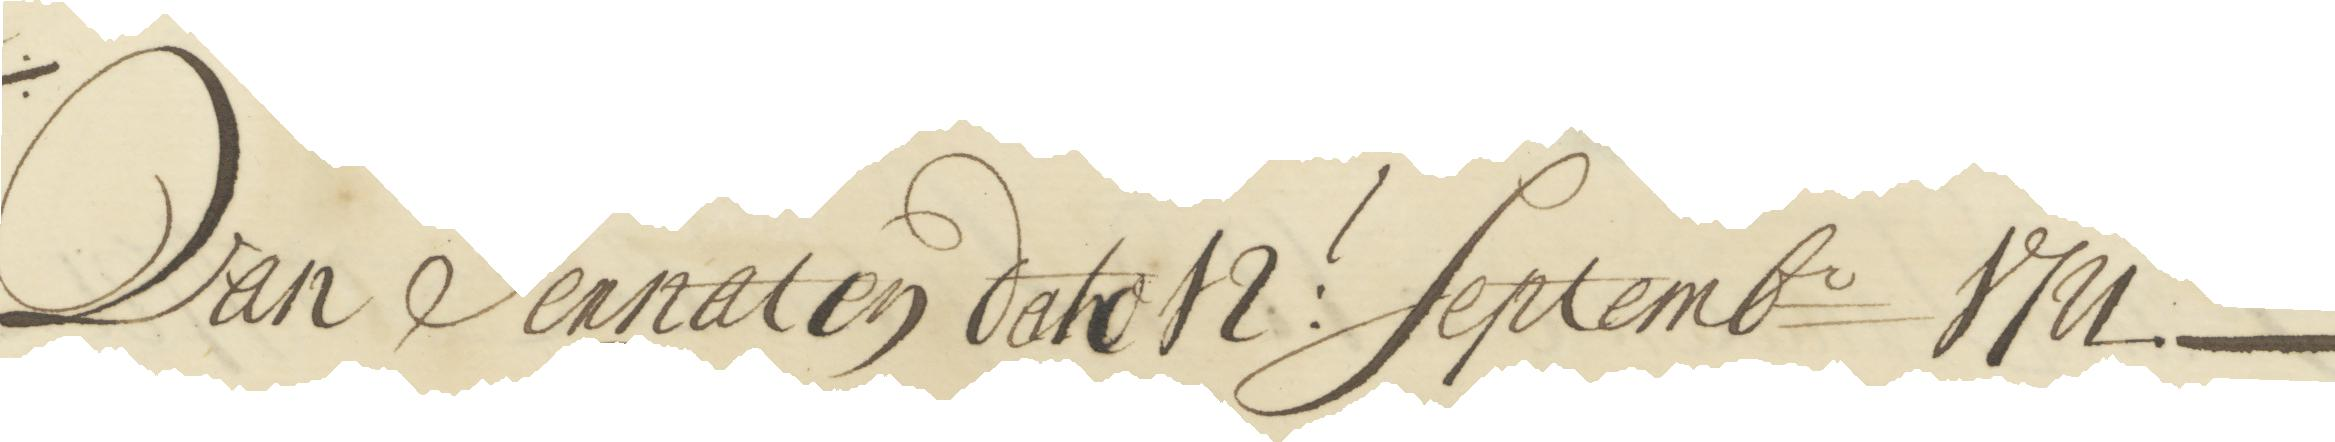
Van Ternaten dato 12:' Septemb=r 1721.—
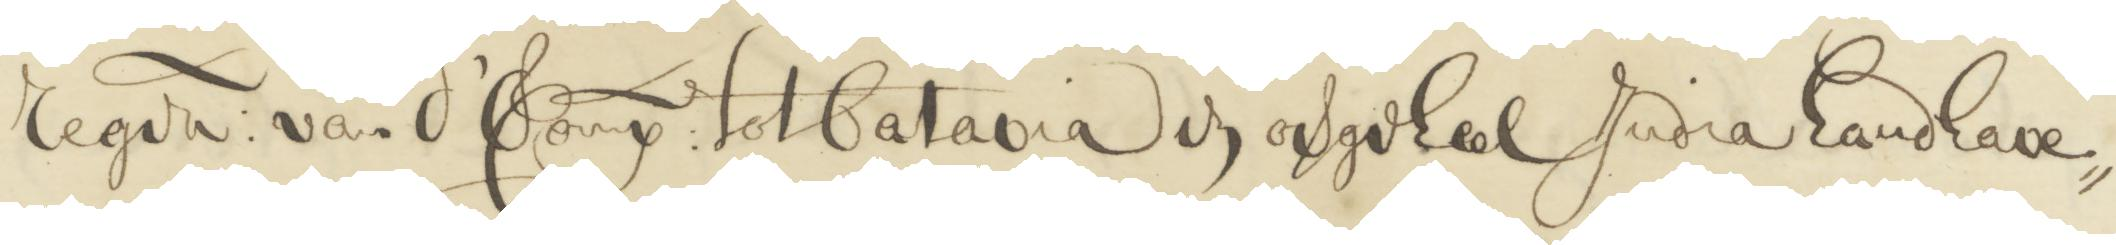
reger: van d’ EComp: tot batavia en over geheel Jndia handhave„
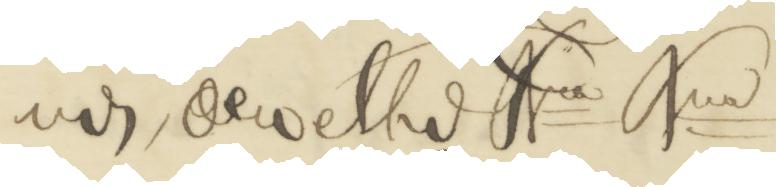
ne, dewelke &:a &:ra
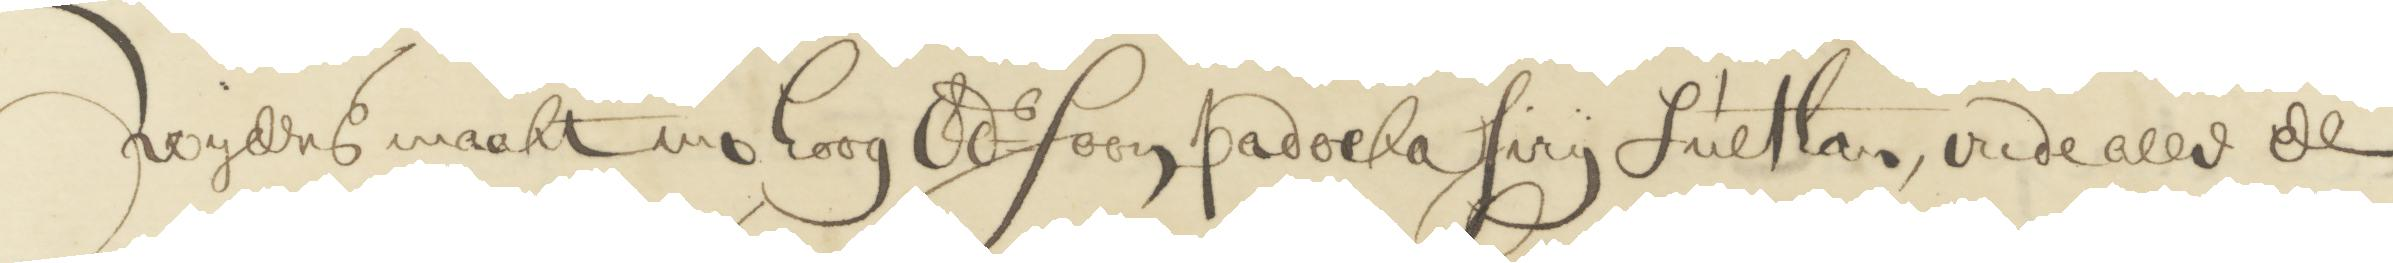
wijders maakt uw hoog Ed=s soon padoeka Sirij Sulthan, ende alle de
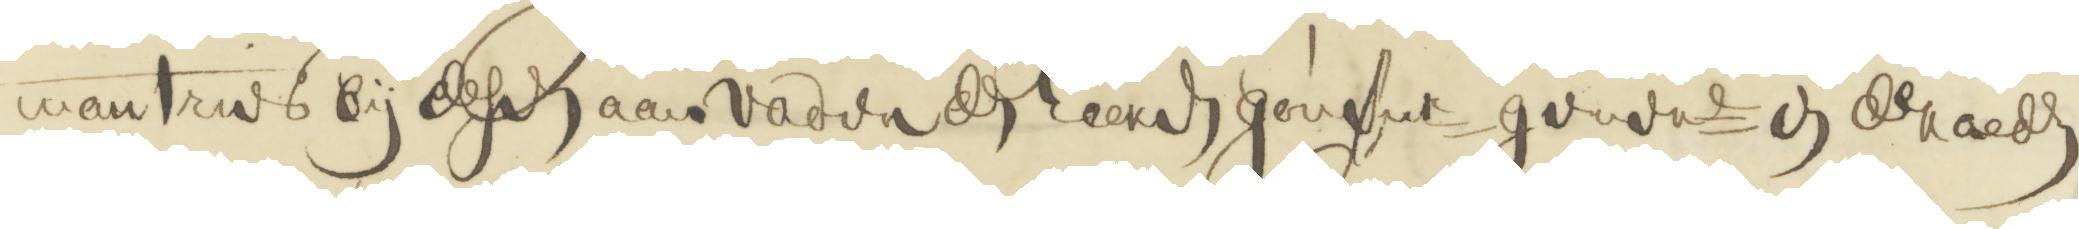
mantries bij desen aan vader den heeren gouvern=r gener=l en de raeden
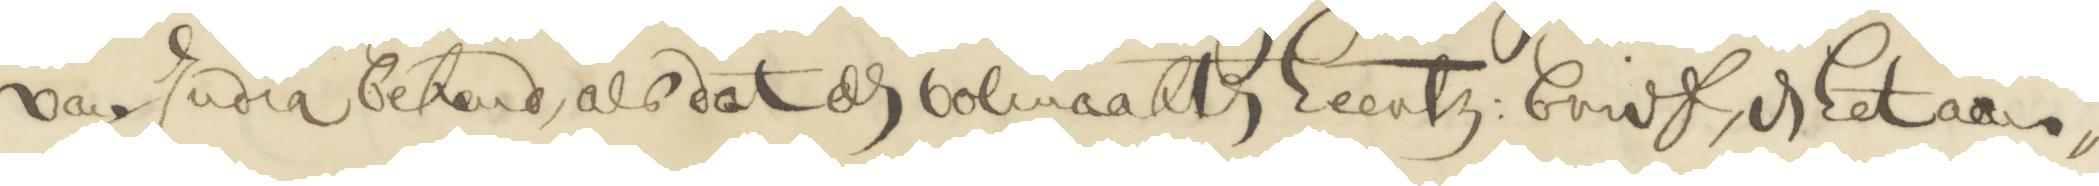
van Jndia bekend, als dat den volmaakten heerlijken brief, en het aan„
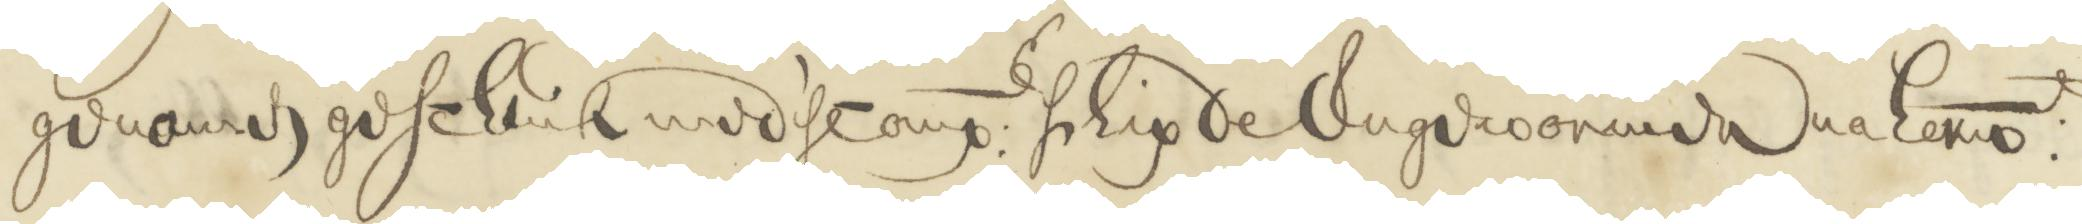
genomen geschenk med 'S Comp:s Schip de Engewormer na herw:e
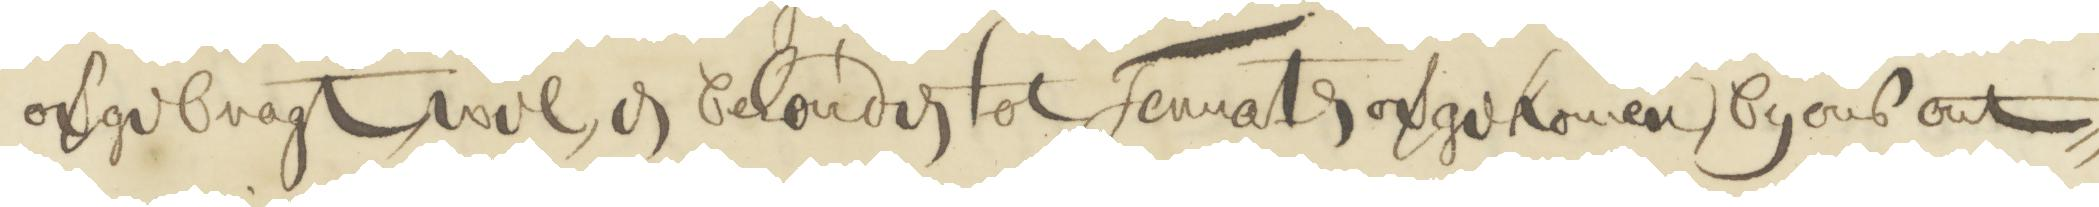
overgebragt wel, en behouden tot Ternaten overgekomen, bij ons ont„
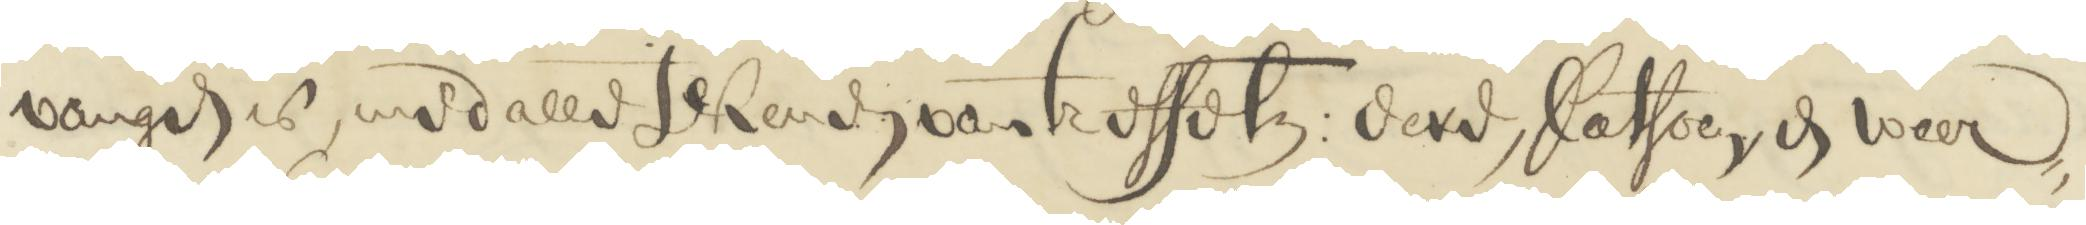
vangen is, med alle tekenen van treffelijke eere, fatsoen en weer„
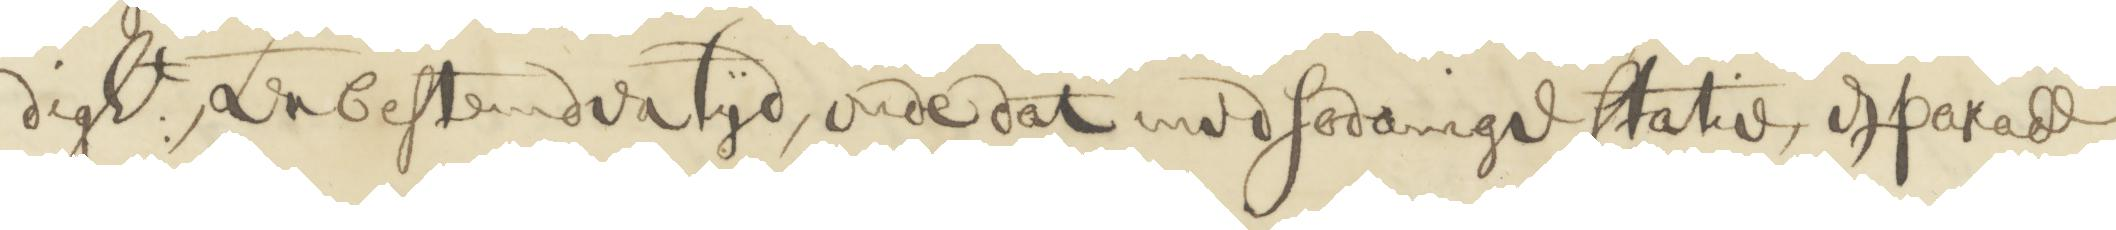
digh:t ter bestemder tijd, ende dat med sodanige statie, en parade
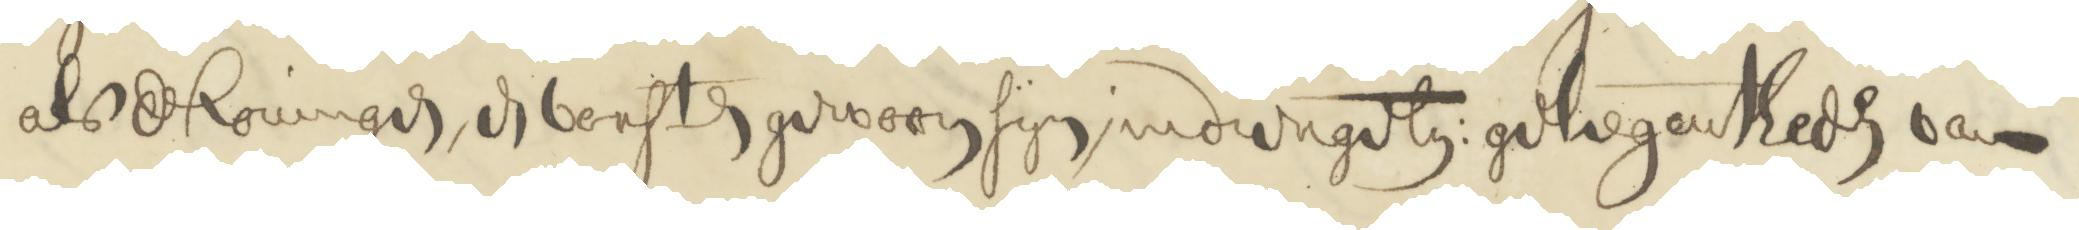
als de koningen, en vorsten gewoon sijn, in diergelijke gelegentheden van
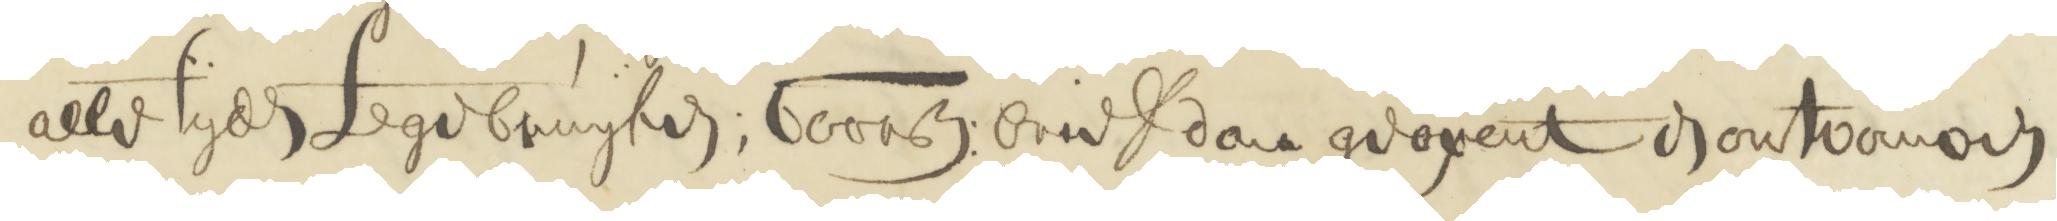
alle tijden te gebruijken; voorsz: brief dan geopent en ontvouwen
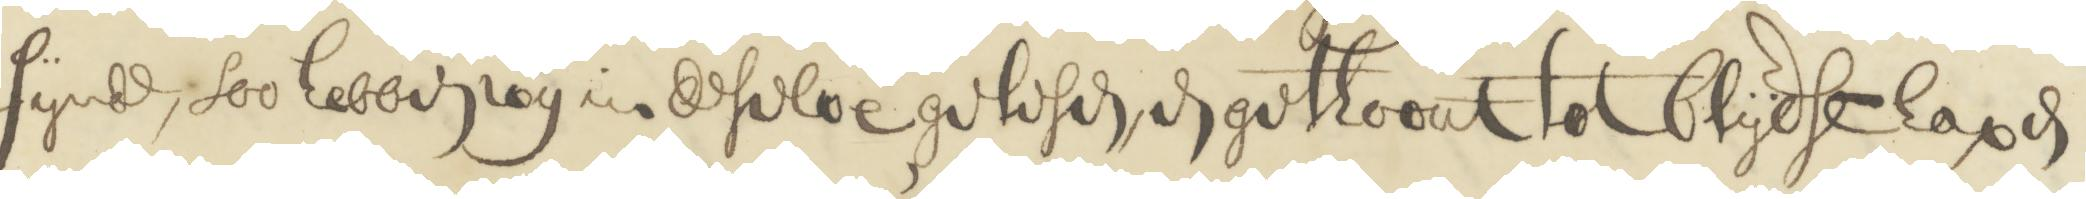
Sijnde, Soo hebben wij in deselve gelesen, en gethoont tot blijdschap en
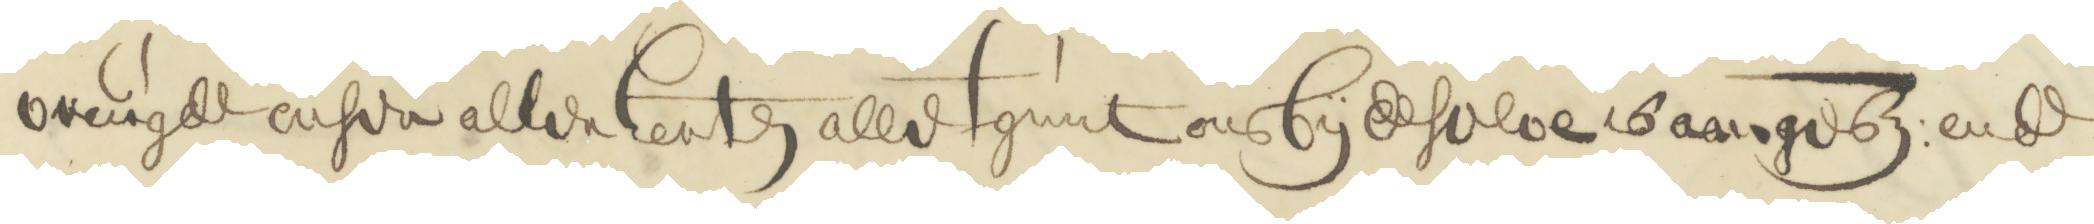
vreugde onser aller herten alle 't gunt ons bij deselve is aangesz: ende
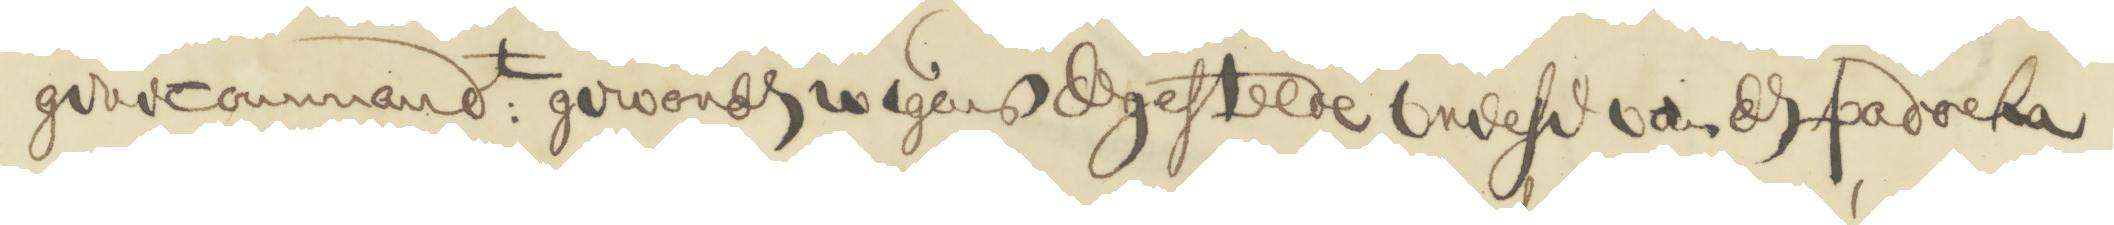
gerecommand:t geworden wegens de gestelde briefe van den padoeka
